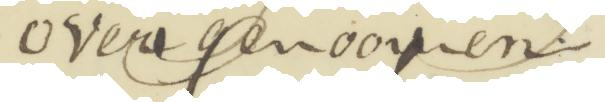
overgenoomen.
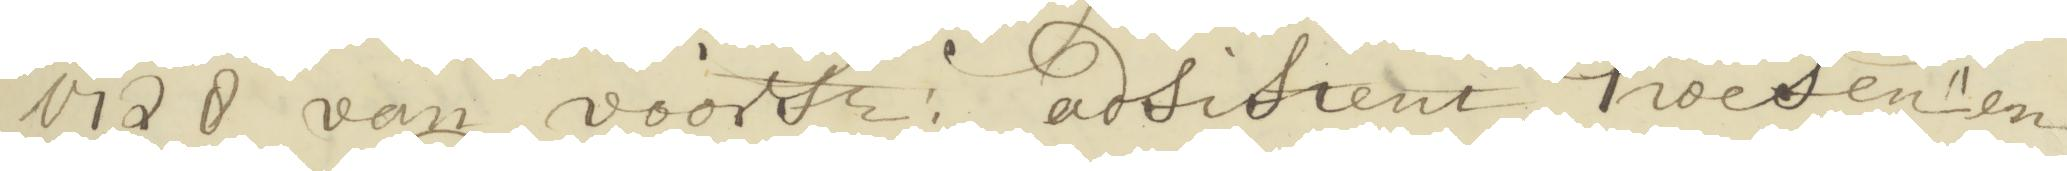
1728 van voorsz: adsistent hoesen " en
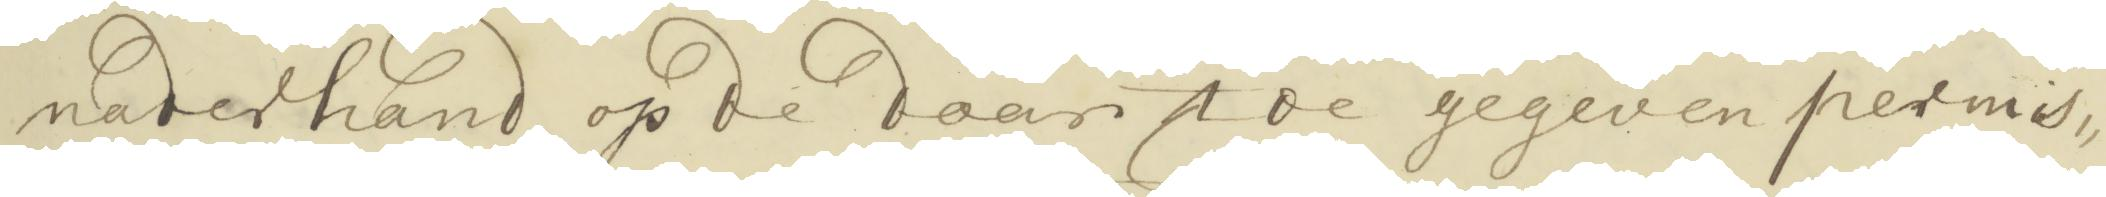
naderhand op de daar toe gegeven permis„
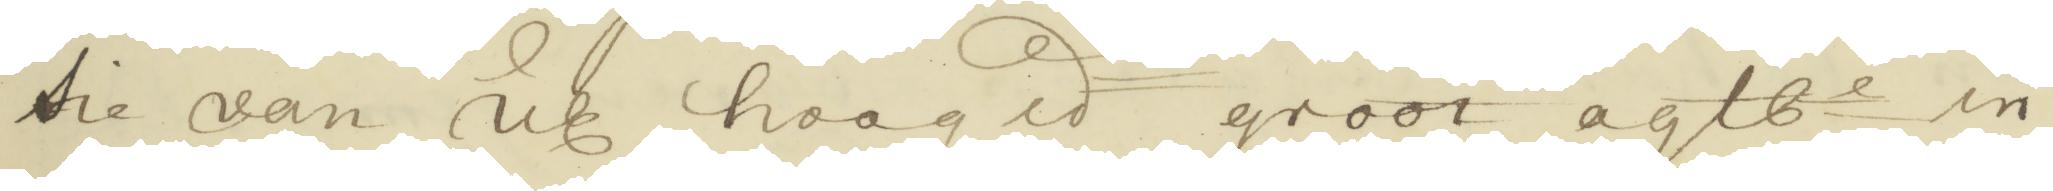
sie van uE hoog ed groot agtb=e in
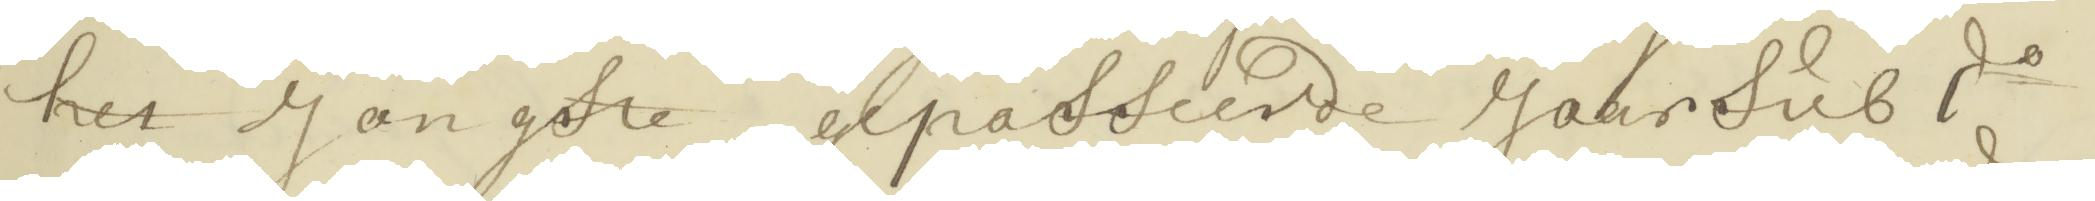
het jongste gepasseerde jaar sub d=o
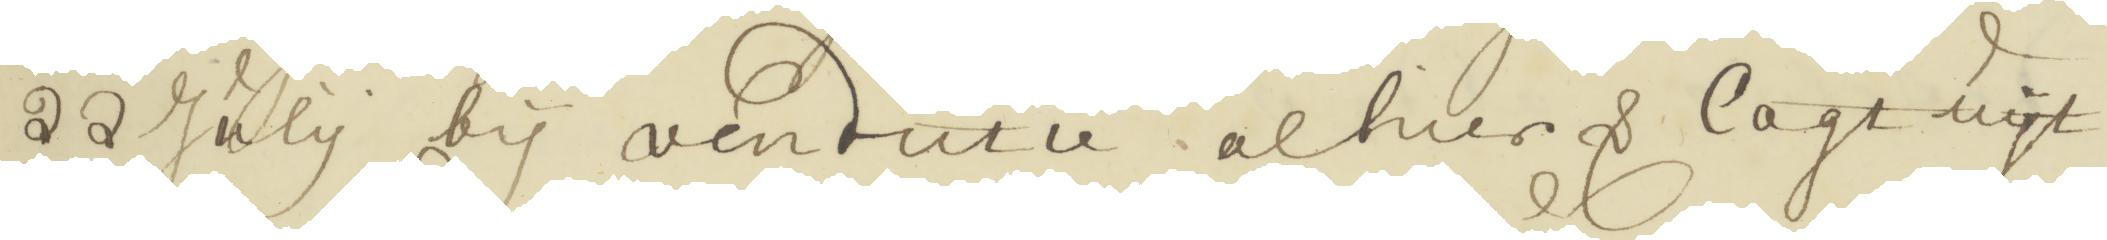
22 Julij bij vendutie alhier ver cogt uijt
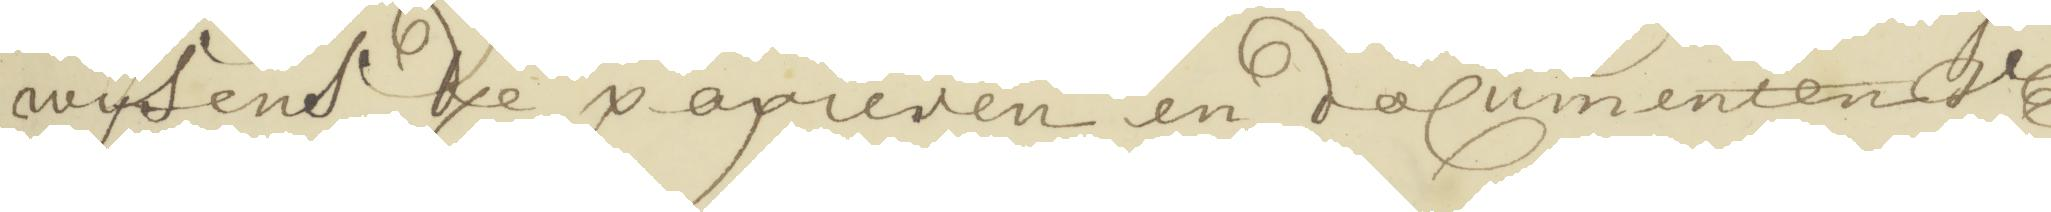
wijsens de papieren en documenten UE
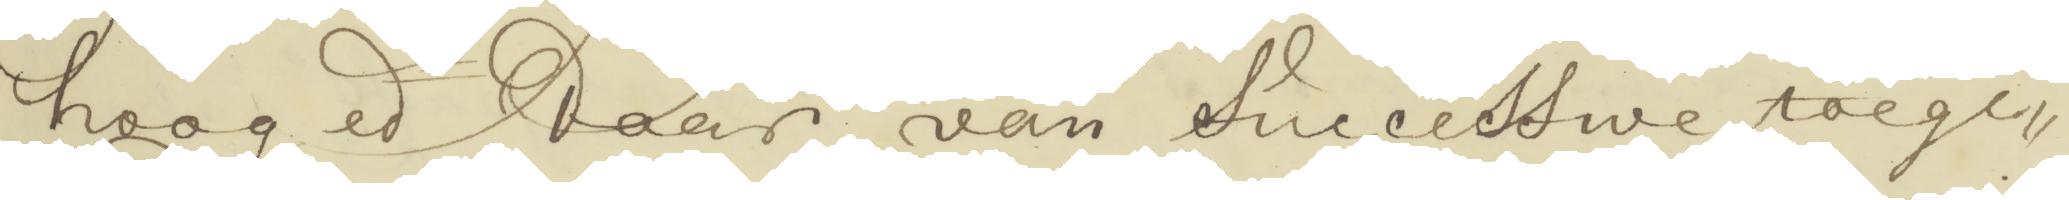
hoog ed= daar van succesive toege„
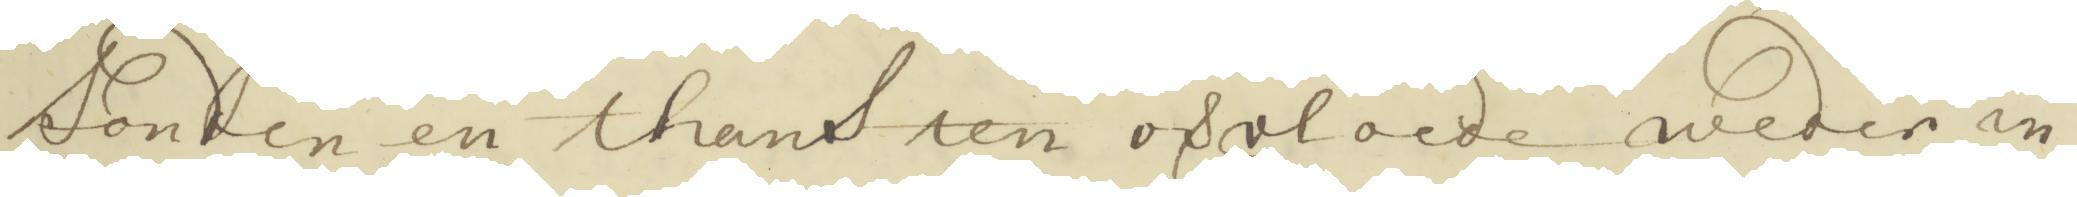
sonden en thans ten overvloede weder in
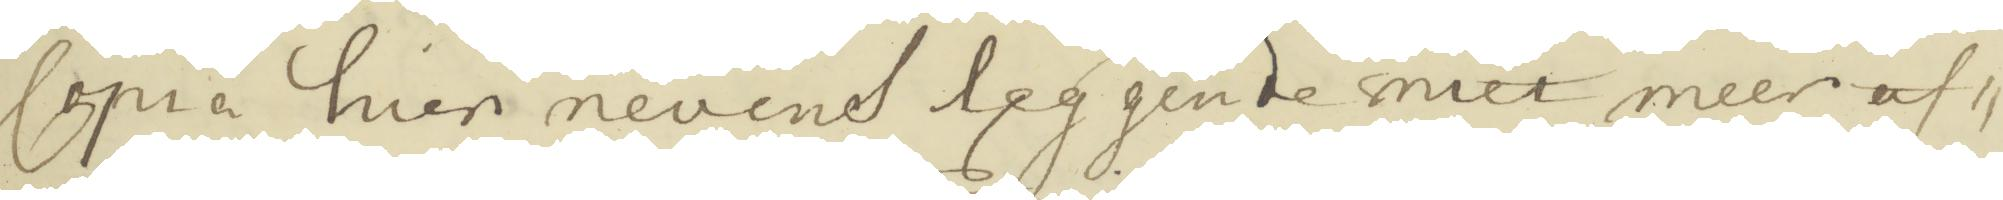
Copia hier nevens leggende miet meer af„
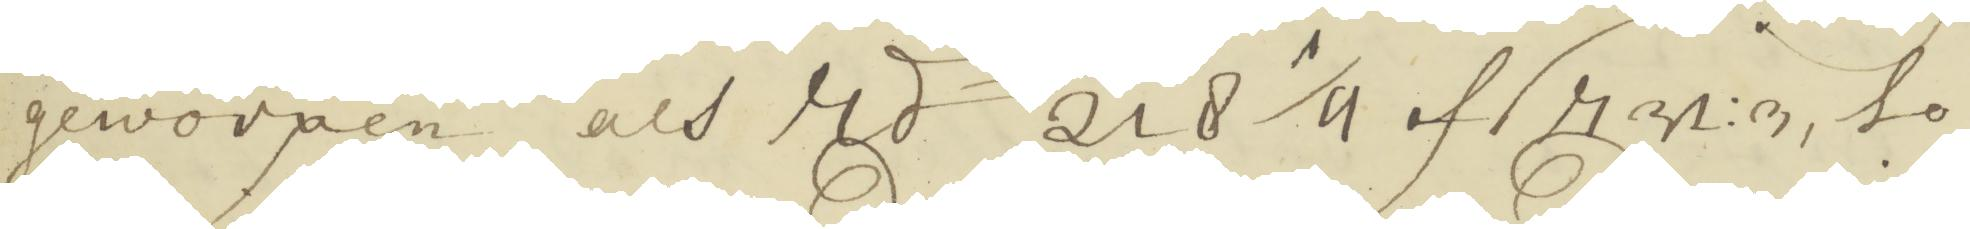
geworpen als rd 218¼ ƒ 1731:3, so
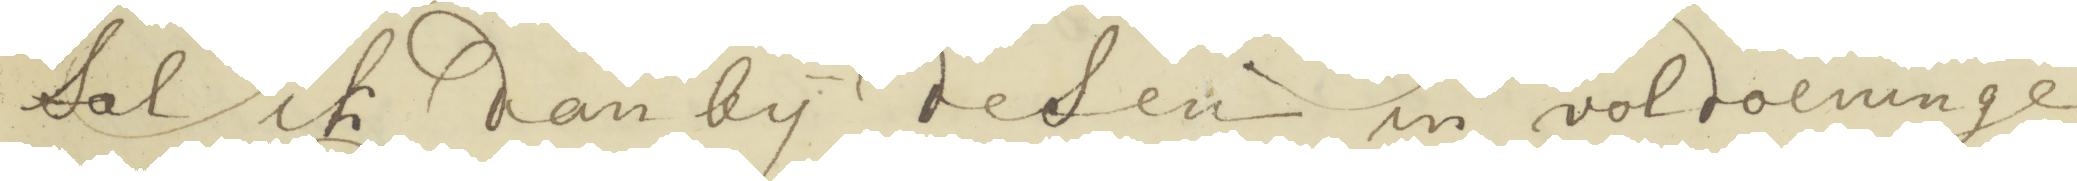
sal ik dan bij desen in voldoeninge
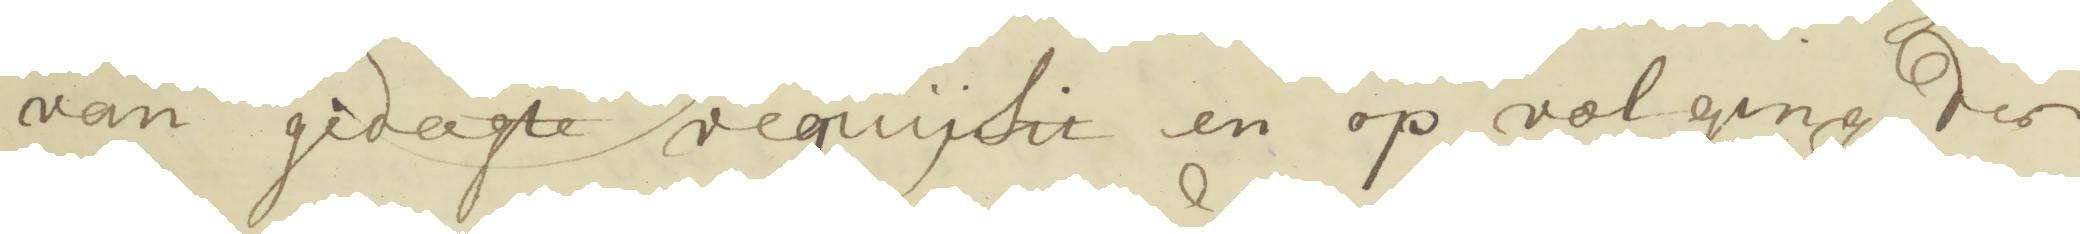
van gedagte requijsit en op volging des
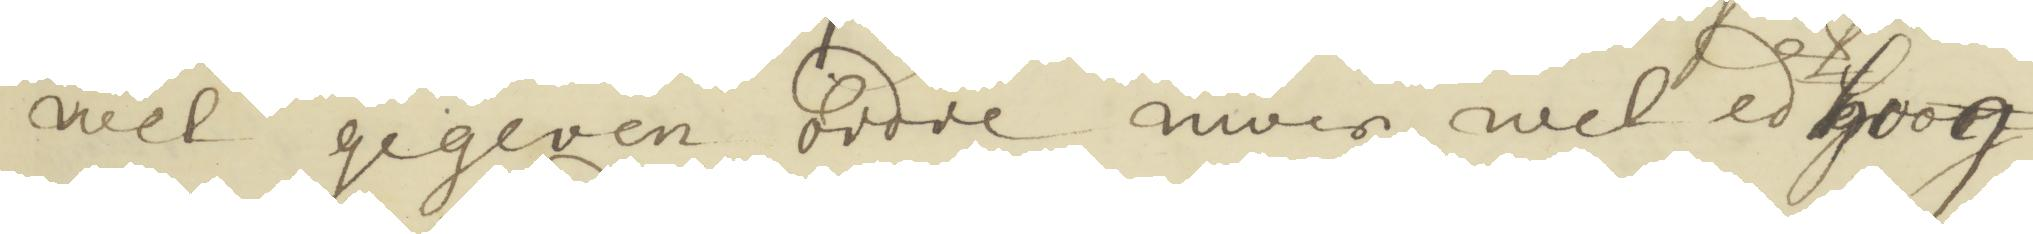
wel gegeven ordre uwes wel ed= Hoog
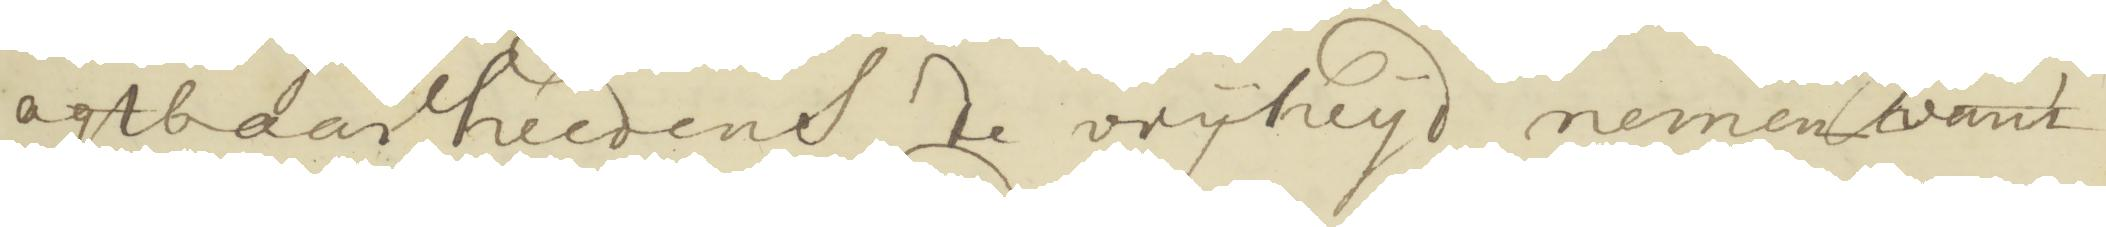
agtbaarheedens de vrijheijd nemen van’t
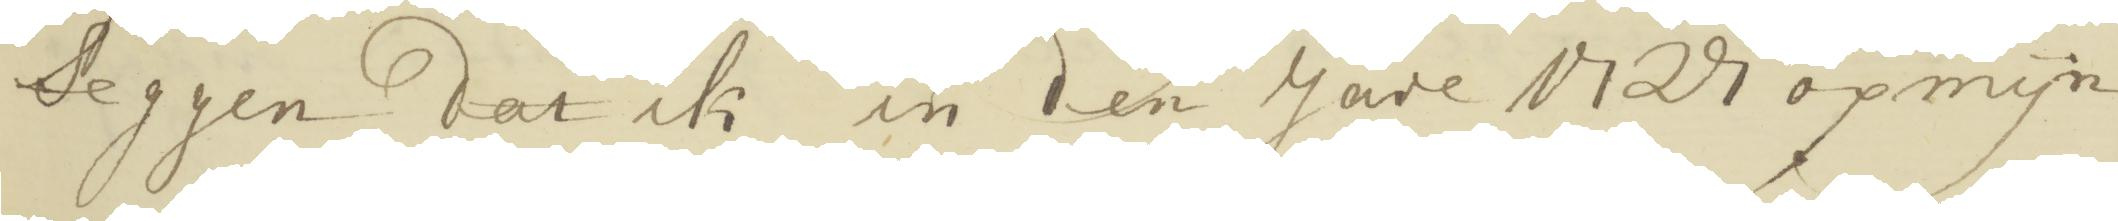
seggen dat ik in den jare 1727 opmijn
